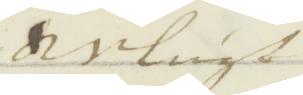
Nvlugt
